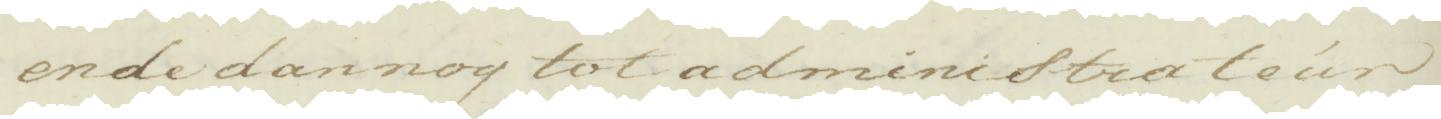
ende dan nog tot administrateur
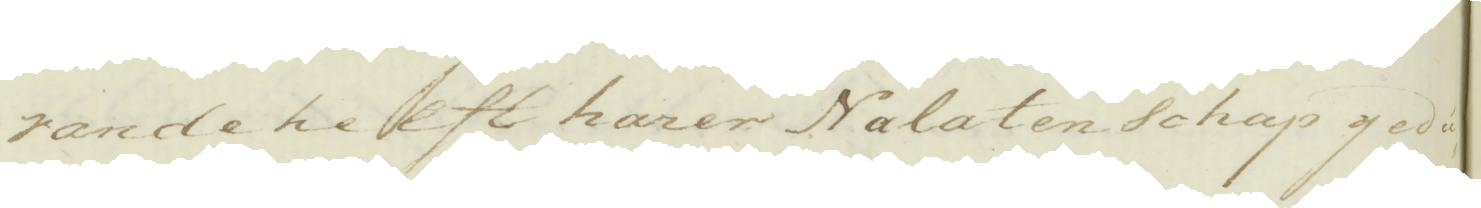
van de helft harer Nalatenschap gedu„
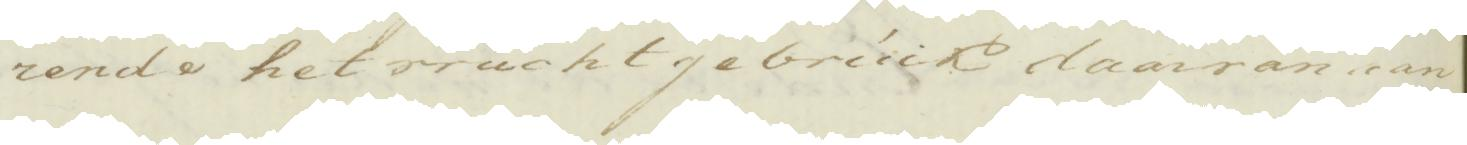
rende het vruchtgebruik daar van aan
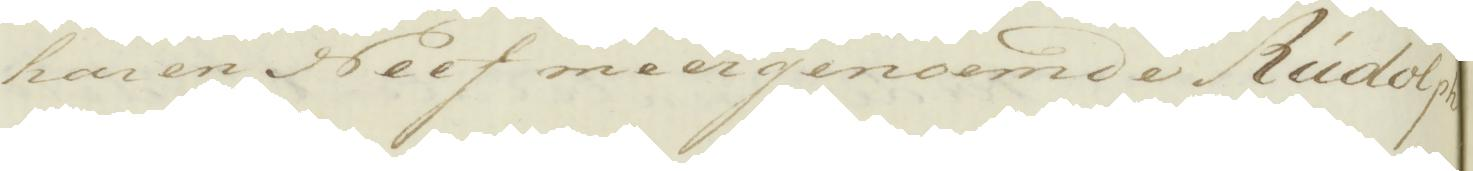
haren Neef meergenoemde Rudolph
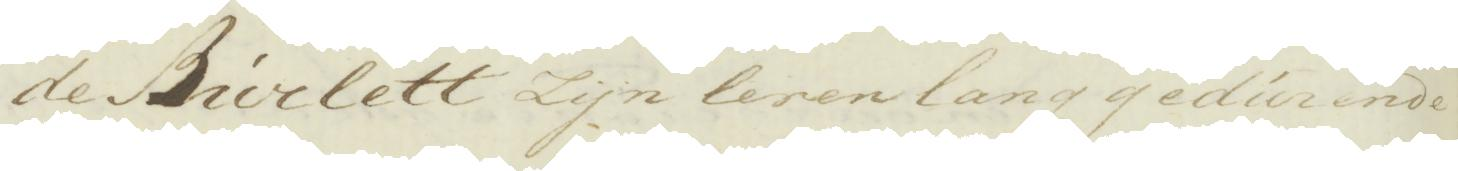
de Burlett zijn leven lang gedurende
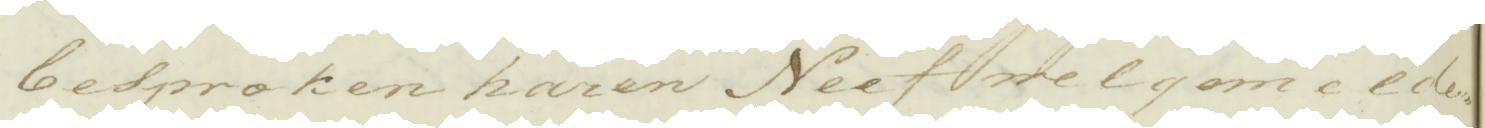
besproken haren Neef welgemelde
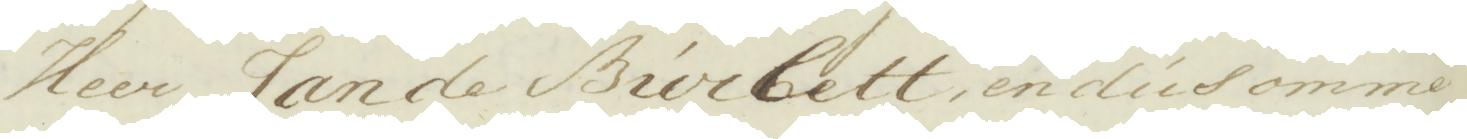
Heer Jan de Burlett, en dus omme
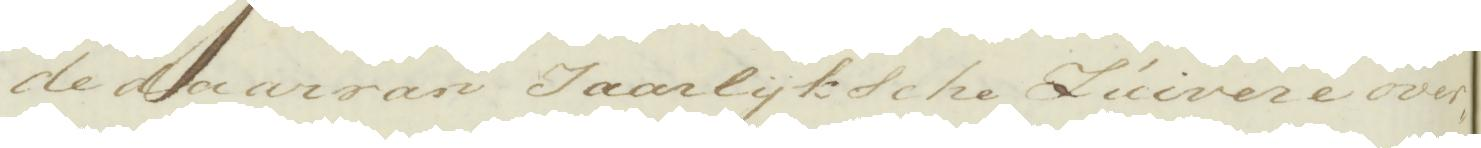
de daarvan Iaarlijksche Zuivere over„
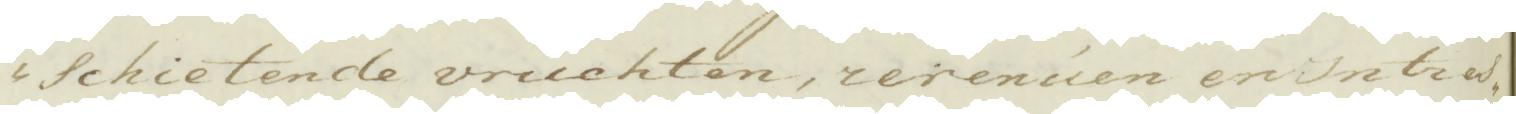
„schietende vruchten, revenuen en Intres„
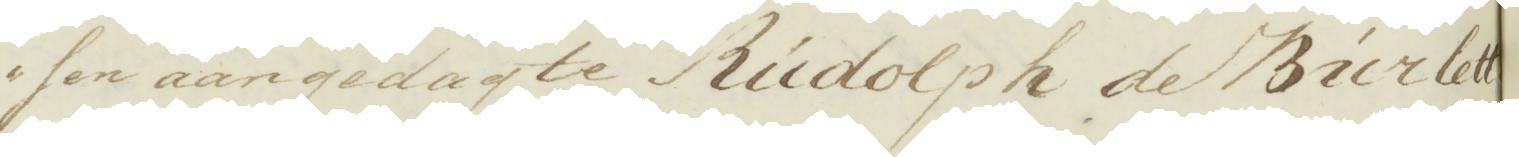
„sen aan gedagte Rudolph de Burlett
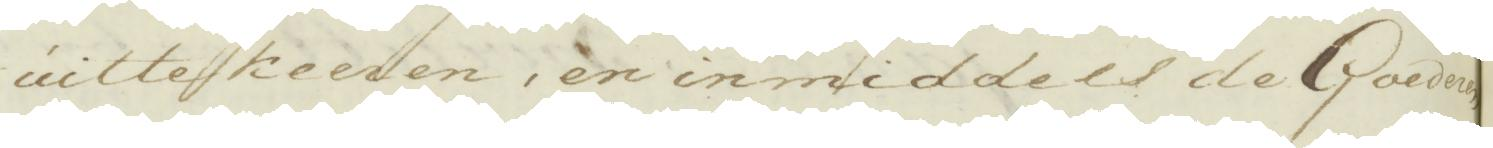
uitte keeren, en inmiddels de Goederen
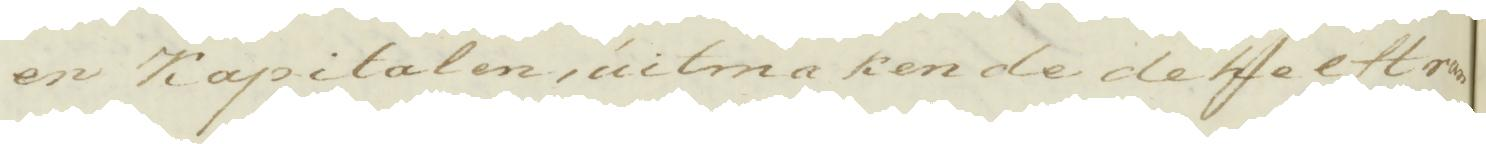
en Kapitalen, uitmakende de helft van
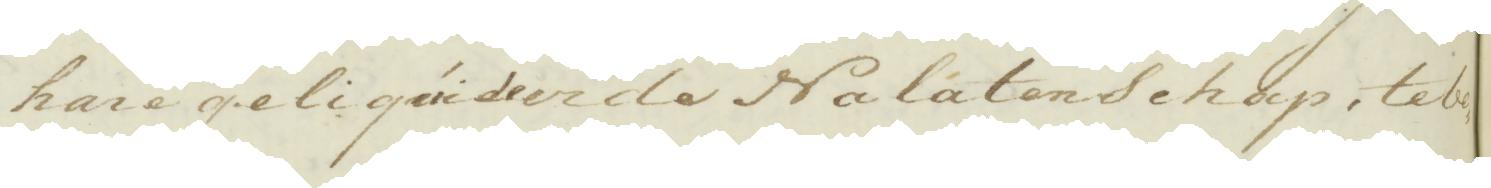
hare geliquideerde Nalatenschap, tebe„
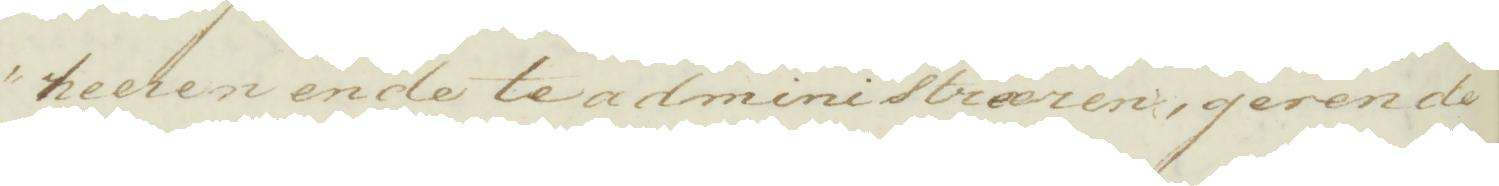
„heeren ende te administreeren, gevende
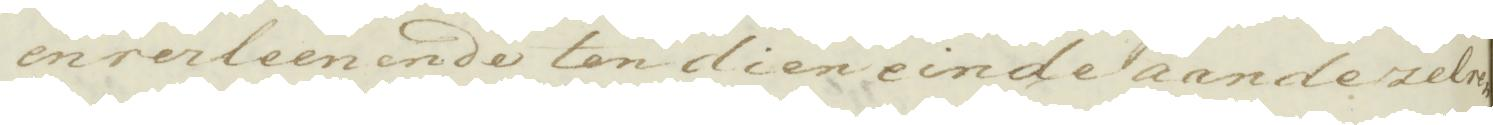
en verleenende ten dien einde aan dezelven
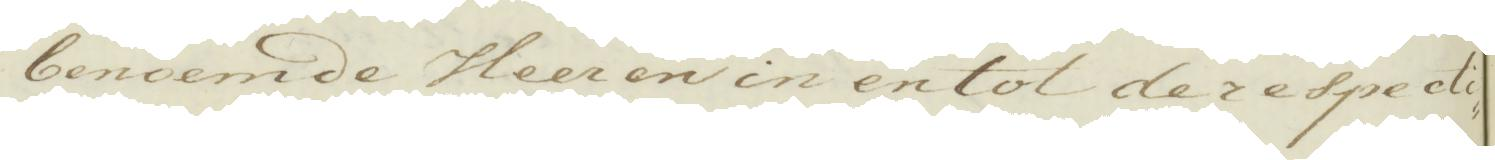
benoemde Heeren in en tot de respecti„
